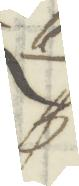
H
